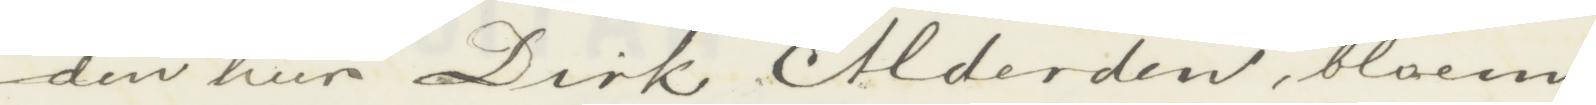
den heer Dirk Alderden, bloem
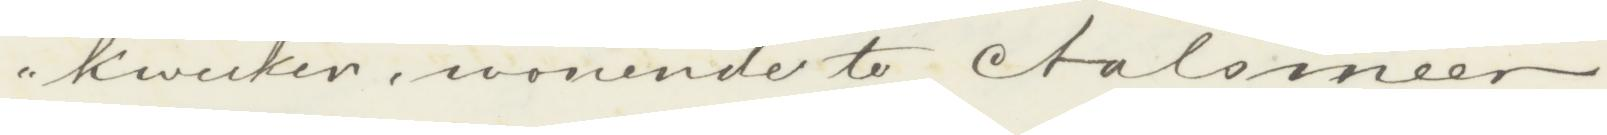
„kweeker, wonende te Aalsmeer
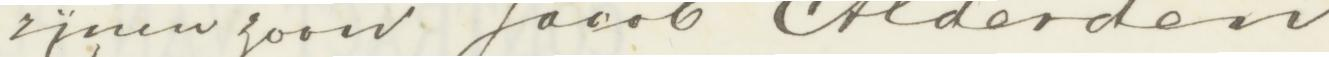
zijnen zoon Jacob Alderden
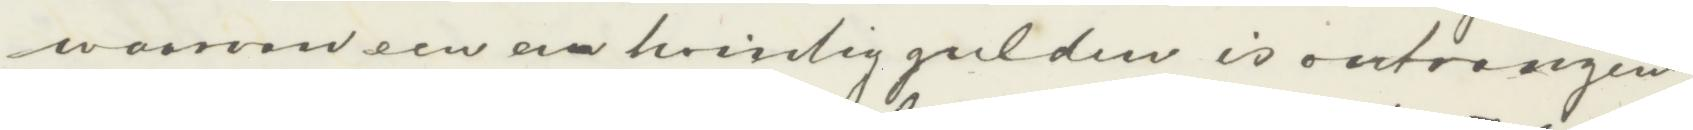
waarvan een en twintig gulden is ontvangen.
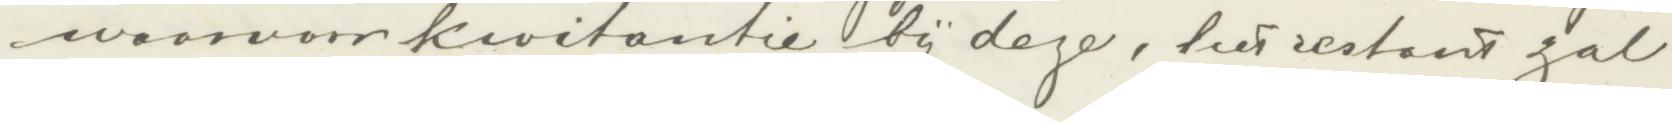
waarvoor kwitantie bij deze, het restant zal
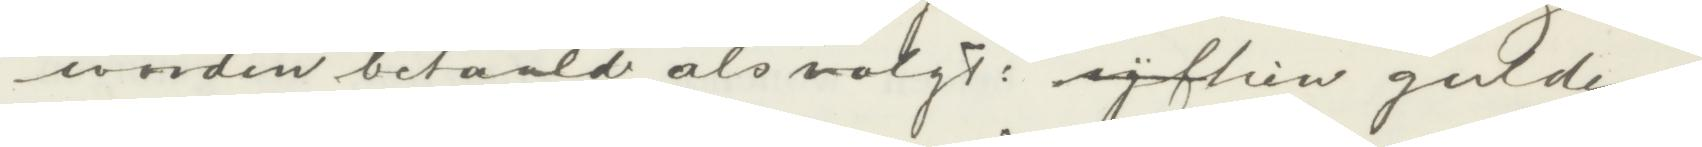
worden betaald als volgt: vijftien gulden
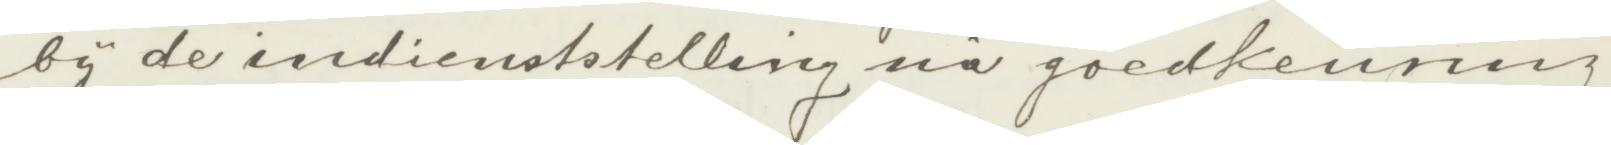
bij de indienststelling na goedkeuring
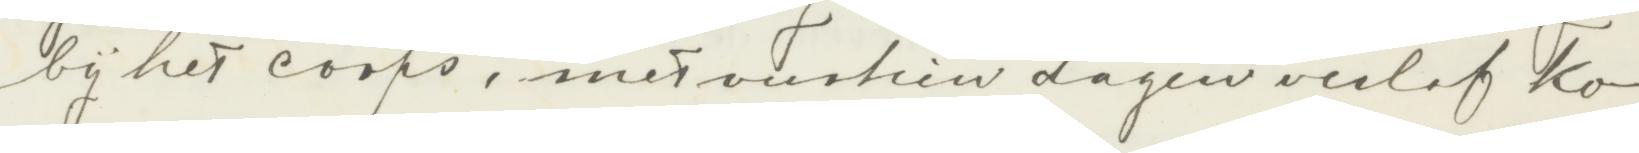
bij het corps, met veertien dagen verlof ko
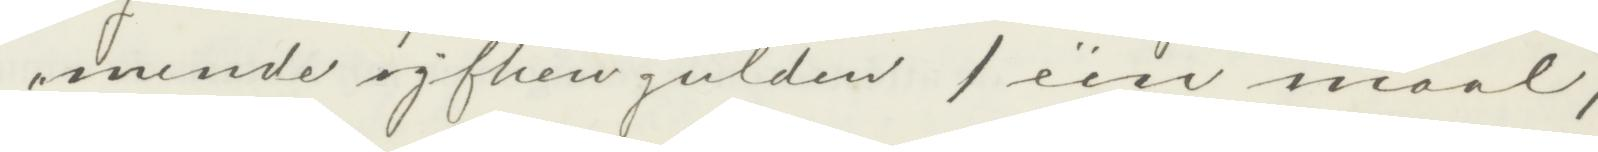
„mende vjftien gulden / één maal/
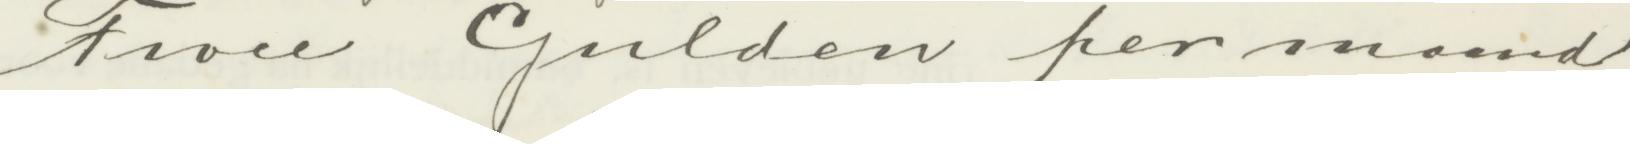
Twee Gulden per maand
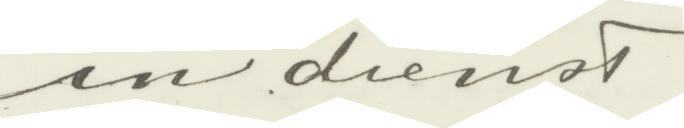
in dienst
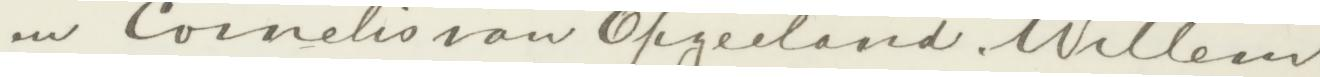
en Cornelis van Opzeeland, Willem
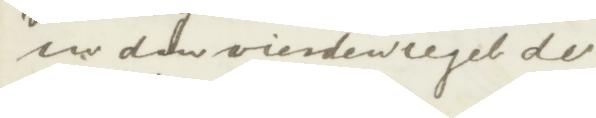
in den vierden regel de
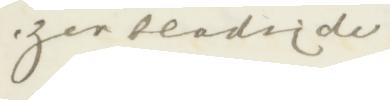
„zer bladzijde
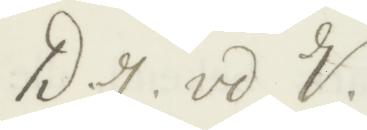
D.J.vd V.
